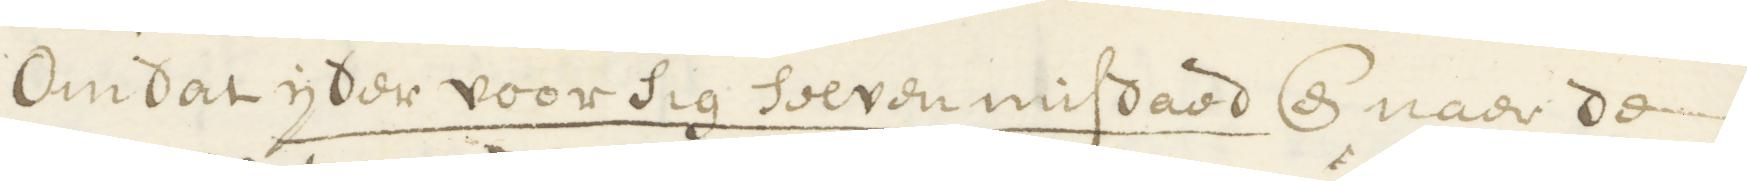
Om dat ijder voor sig selven misdaed ende naer de
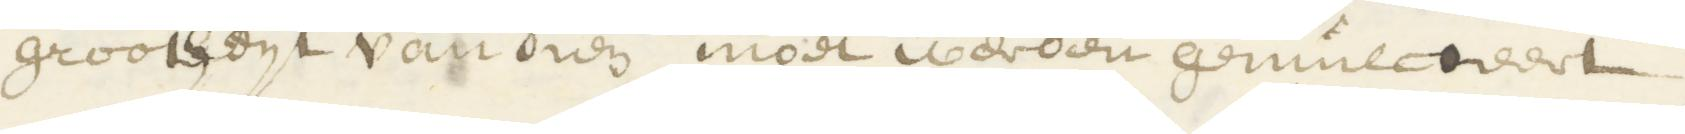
grootheijt van dien moet werden gemulcheert
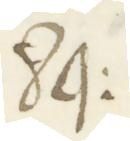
84:
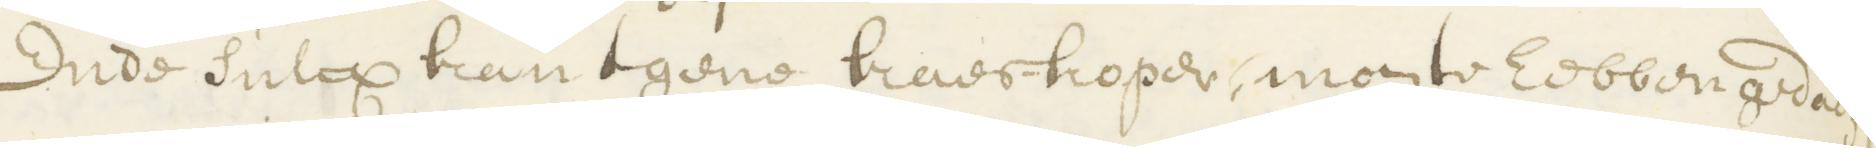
Ende sulcx kan tgene kaes-koper, monte hebben gedaen
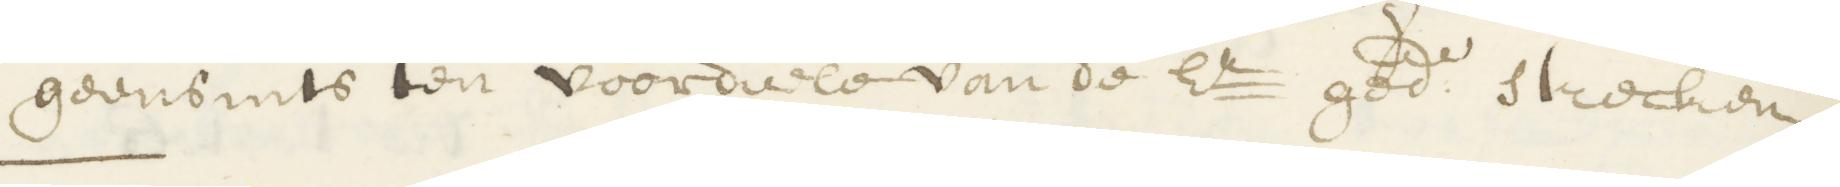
geensints ten voordeele van de h=r ged:e strecken
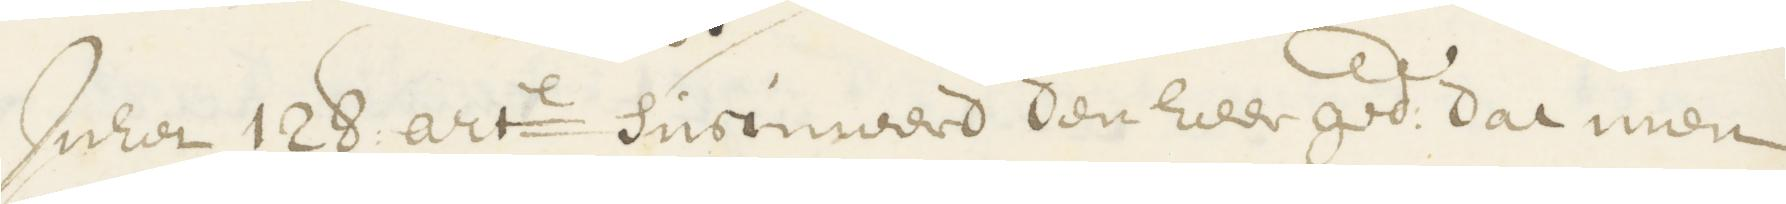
Jnhet 128: art=l sustineerd den heer ged:e dat men
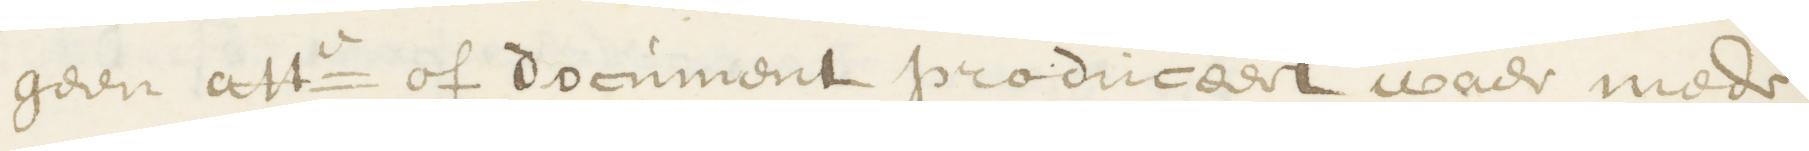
geen att=e of document produceert waer mede
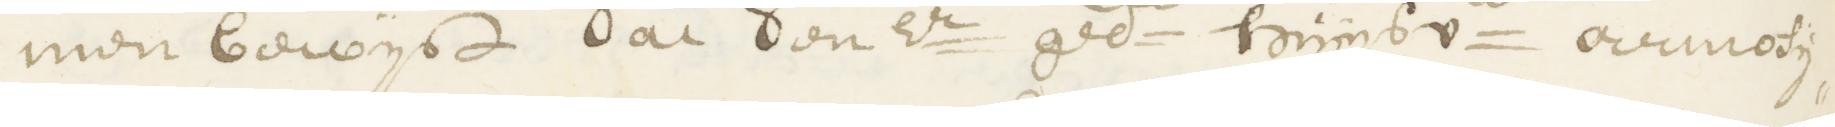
men bewijst dat den h=r ged=r huijsv=r armosij
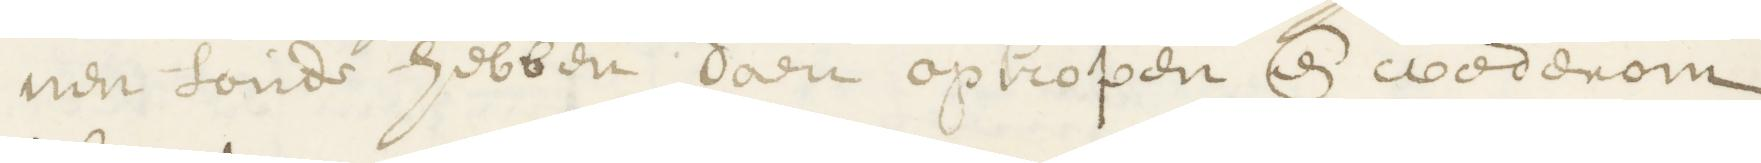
nen soude hebben doen opkopen ende wederom
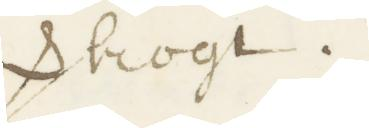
verkogt.
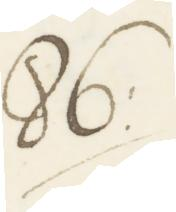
86:
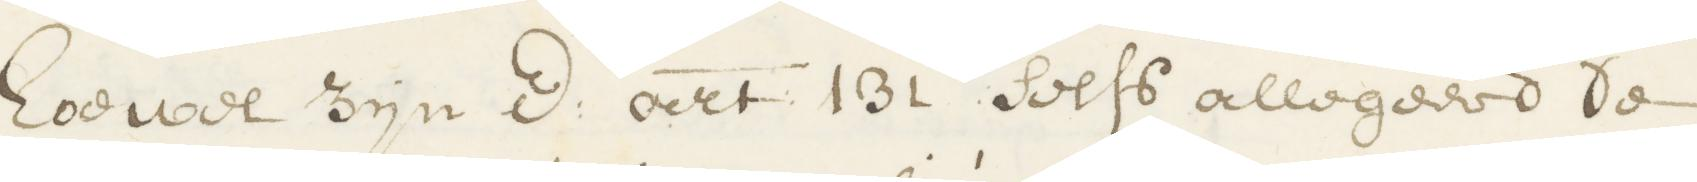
hoe wel zijn E: art: 131: selfs allegeerd de
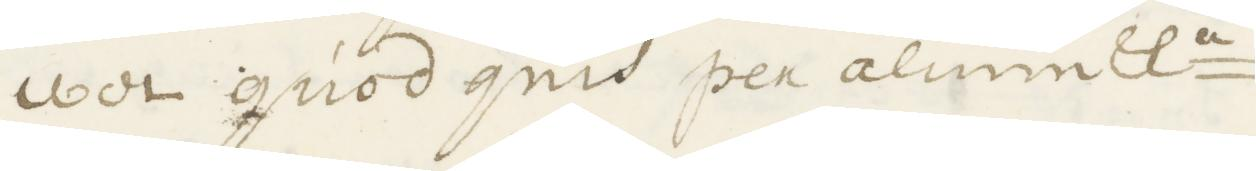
wet quod quis per alium &=a
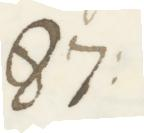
87:
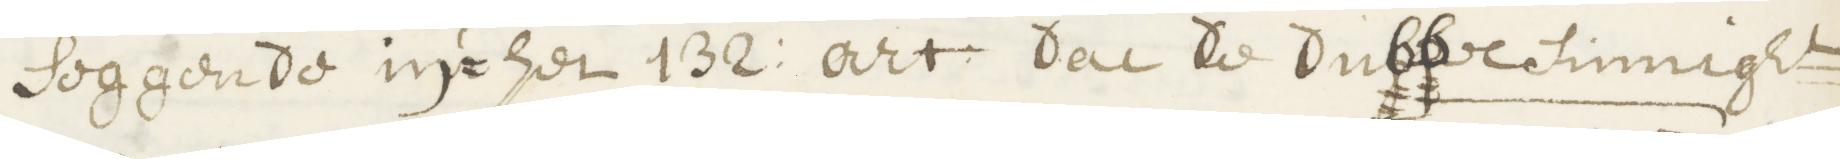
seggende in't het 132: art: dat de dubbelsinnigh=t
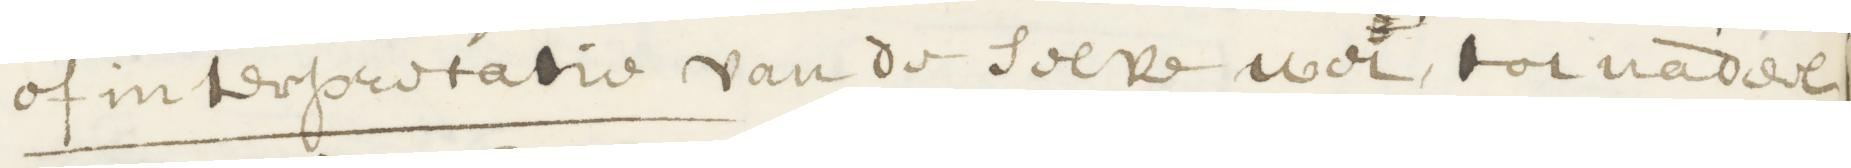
of interpretatie van de selve wet, tot nadeel
